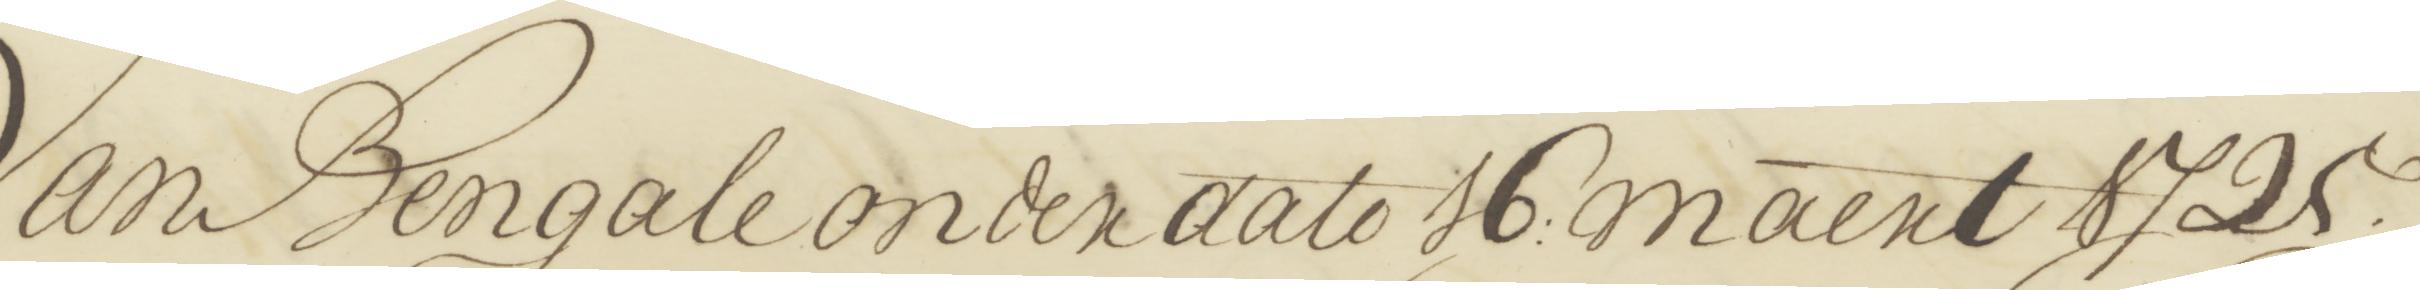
Van Bengale onder dato 16: maert 1725:
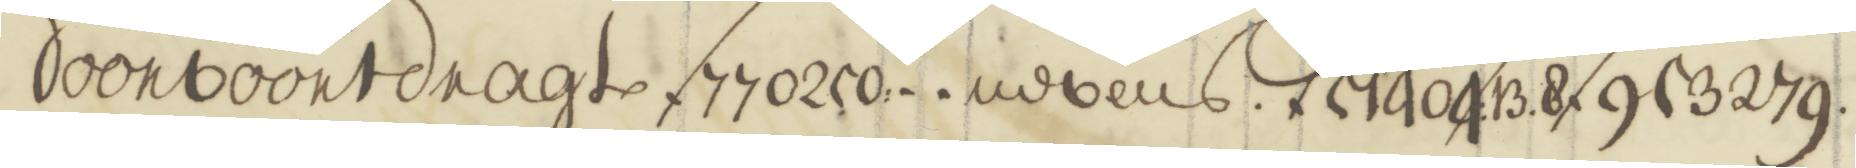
door voortdragt ƒ770250: - - nevens . ƒ51404:13.8ƒ953279
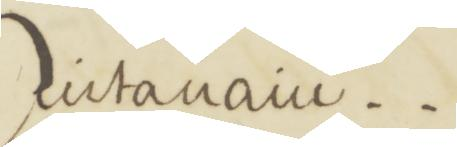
Uitanain - -
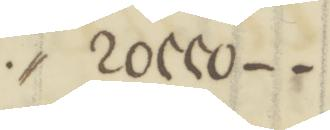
„ 20550 – –
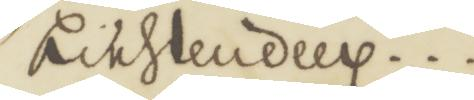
kirstendeep - -
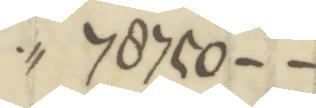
„ 78750 – –
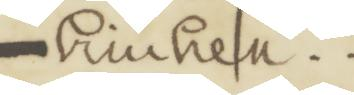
kinker -
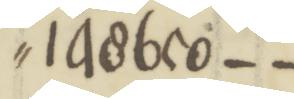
„ 148650 –
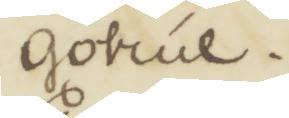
gokul
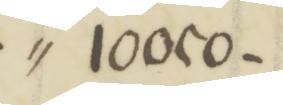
„ 10050 –
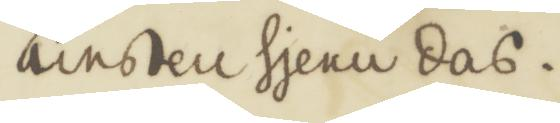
kirsten sjern das
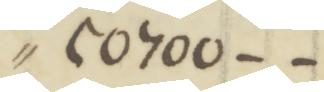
„ 50700 – –
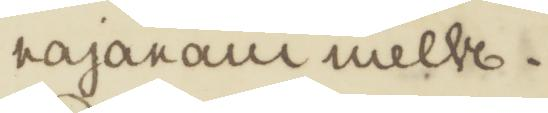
rajaram melk
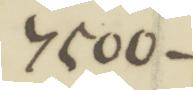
7500 –
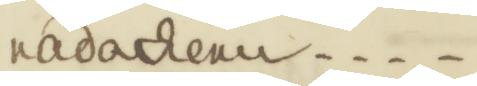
radachern - - - -
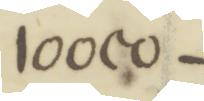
10050 –
